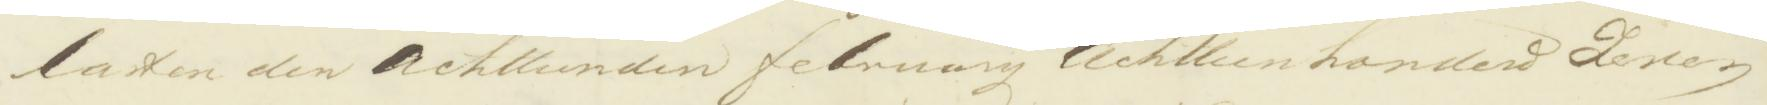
lasten den Achttienden february Achttien honderd Zeven
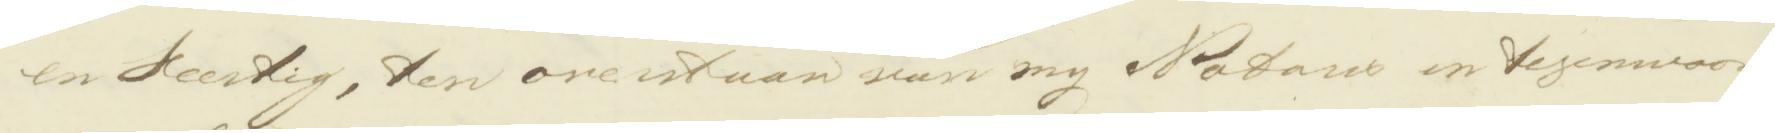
en veertig, ten overstaan van my Notaris in tegenwoor
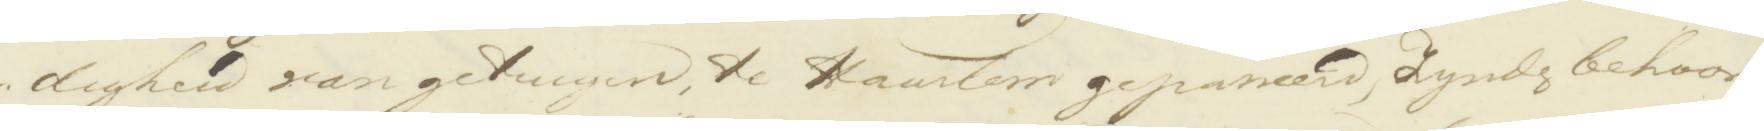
digheid van getuigen, te Haarlem gepasseerd, zynde behoor
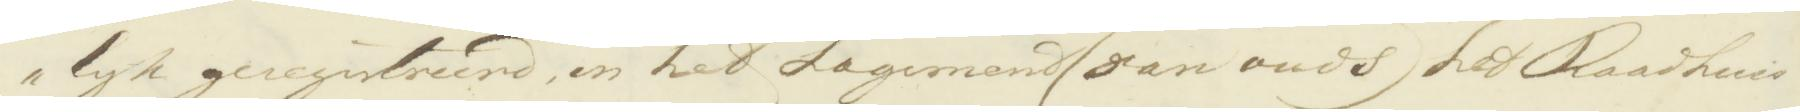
„lyk geregistreerd, in het Logement (van ouds) het Raadhuis
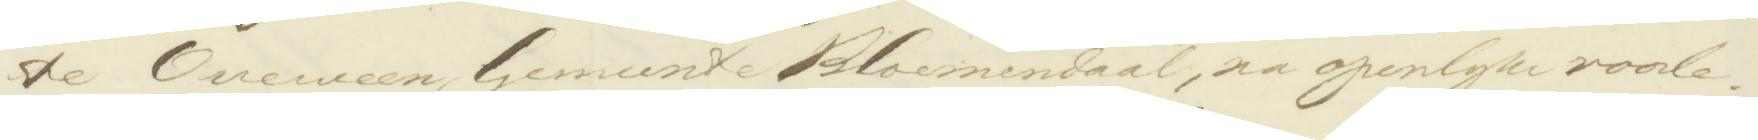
te Overveen, Gemeente Bloemendaal, na openlyke voorle„
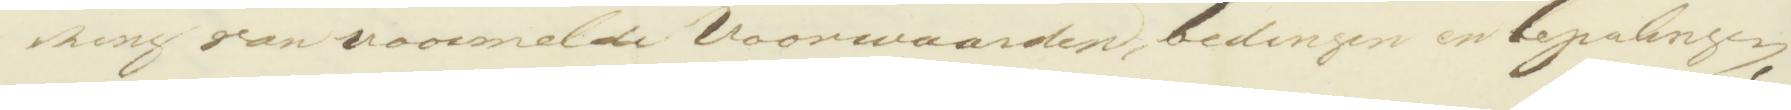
zing van voormelde voorwaarden, bedingen en bepalingen,
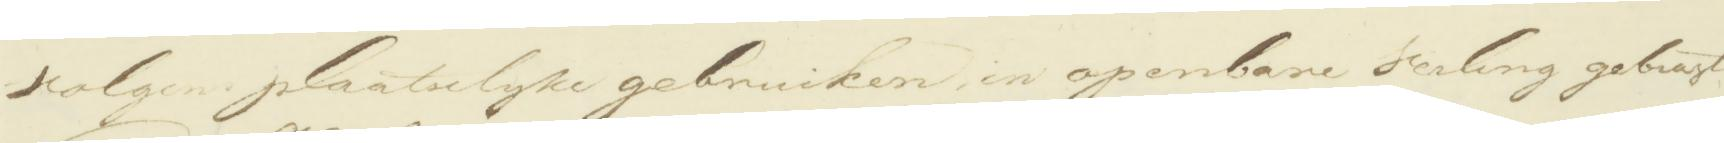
volgens plaatselyke gebruiken, in openbare Veiling gebragt
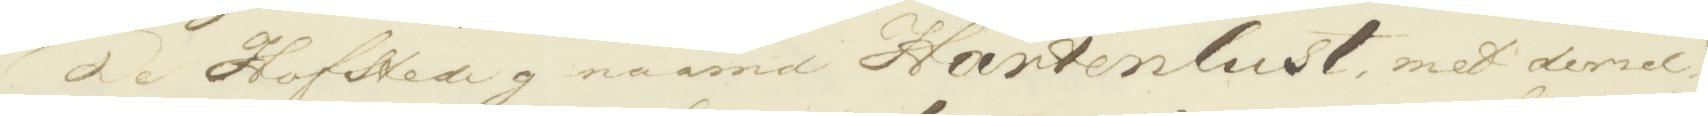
De Hofstede g naamd Hartenlust, met derzel„
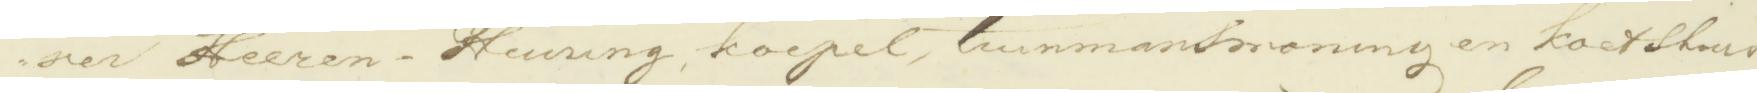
„ver Heeren- Huizing, koepel, tuinmanswoning en koetshuis
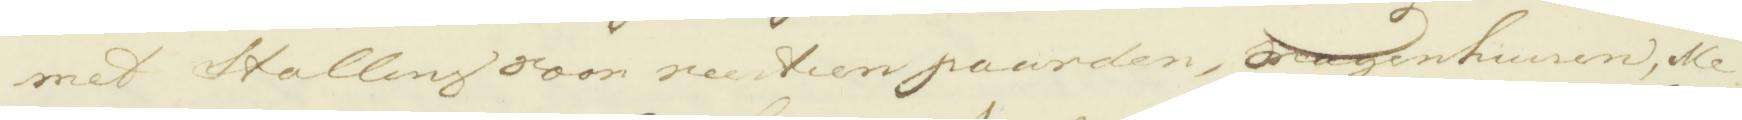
met stalling voor veertien paarden, wagenhuizen, Me
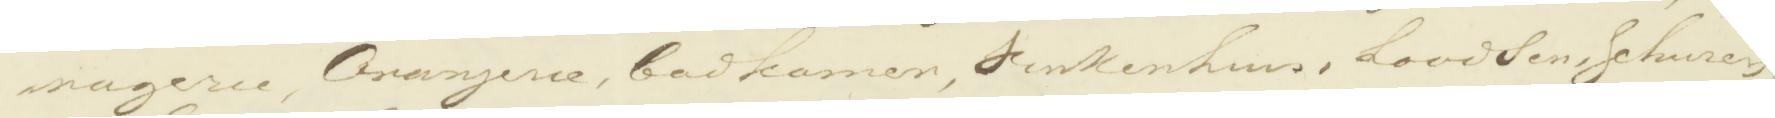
nagerie, Orangerie, badkamer, Vinkenhuis, Loodsen, Schuren
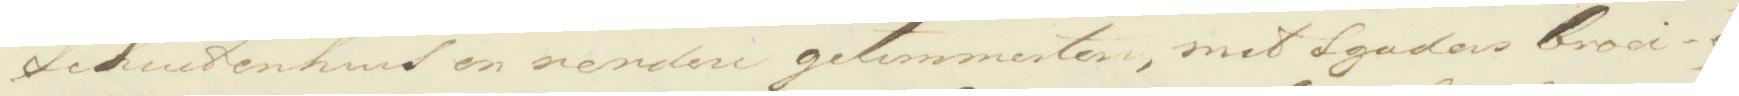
schuitenhuis en verdere getimmerten, mitsgaders broei- en
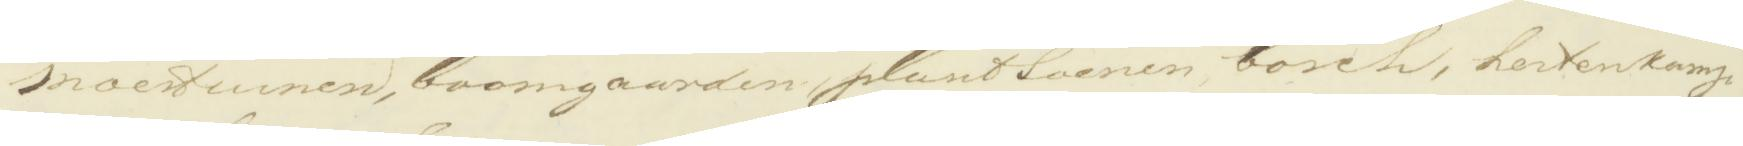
moestuinen, boomgaarden, plantsoenen, bosch, hertenkamp
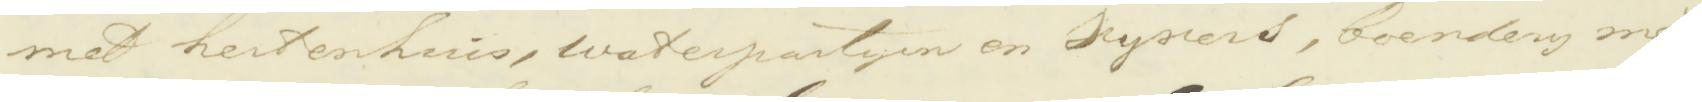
met hertenhuis, waterpartyen en vyvers, boerdery met
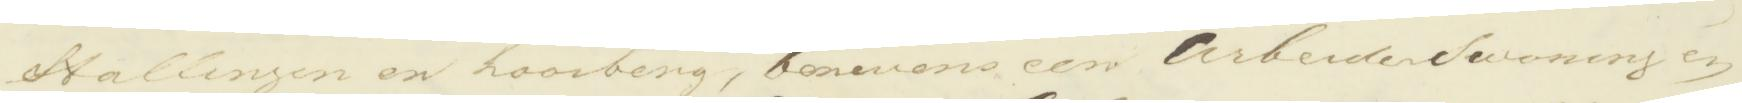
stallingen en hooiberg, benevens een Arbeiderswoning en
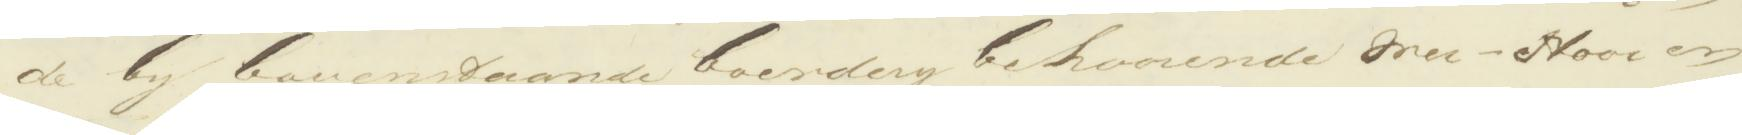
de by bovenstaande boerdery behoorende wei- Hooi en
